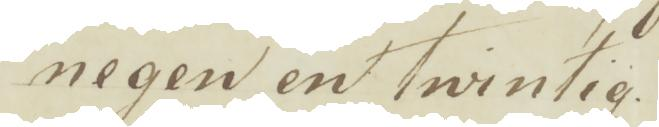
negen en twintig.
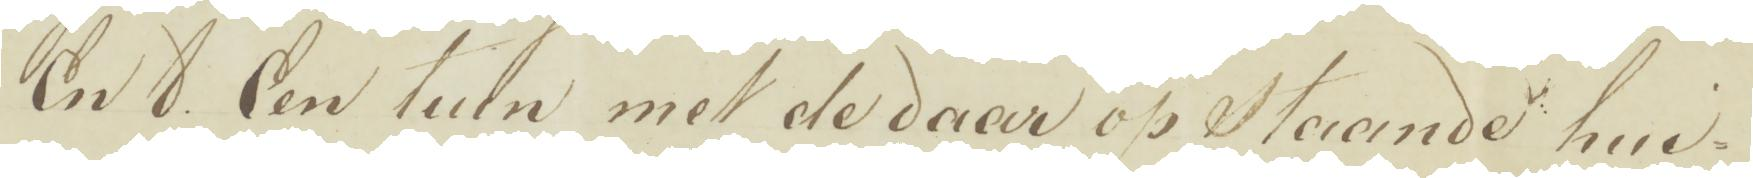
En 8. Een tuin met de daar op staande hui=
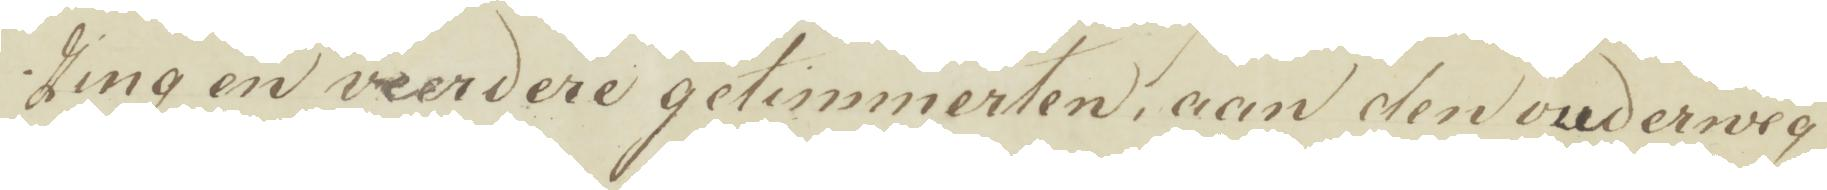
,zing en veerdere getimmerten, aan den ouderweg
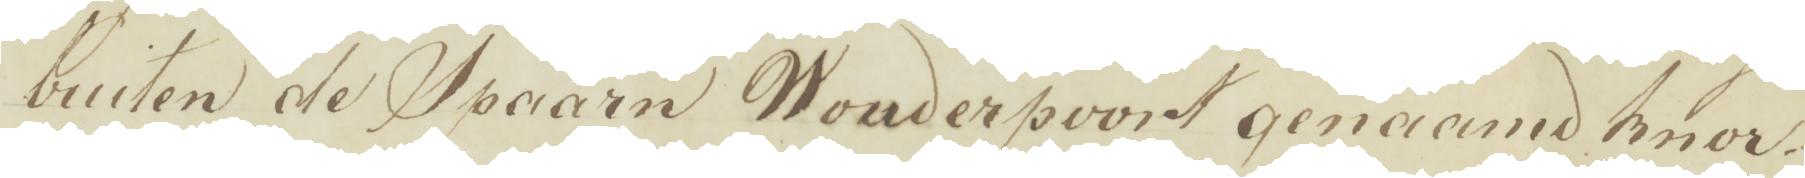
buiten de Spaarn Wonderpoort genaamd knor,
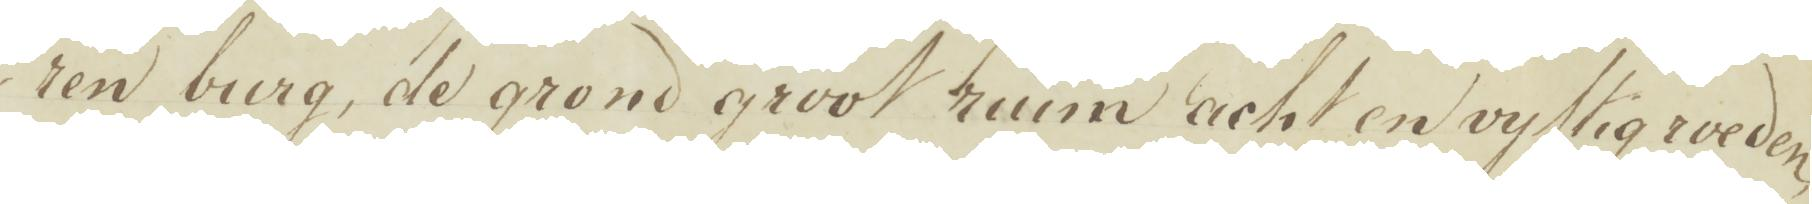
,ren burg, de grond groot ruim acht en vyftig roeden
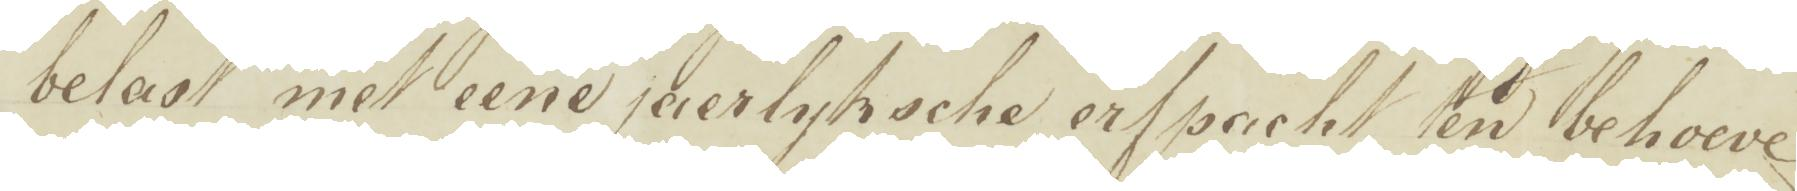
belast met eene jaerlyksche erfpacht ten behoeve
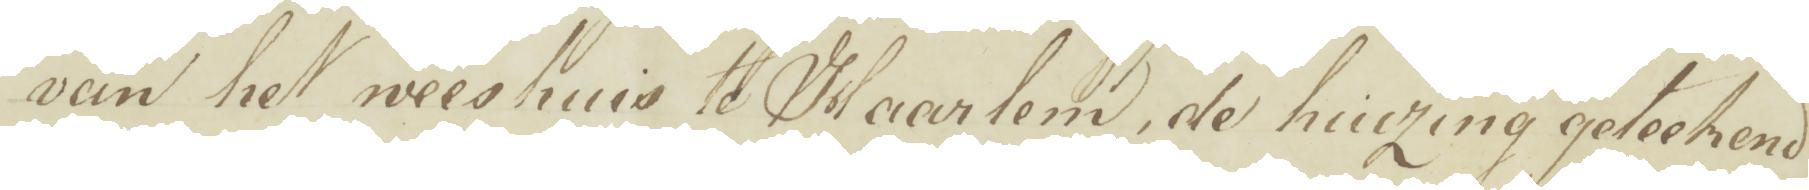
van het weeshuis te Haarlem, de huizing geteekend
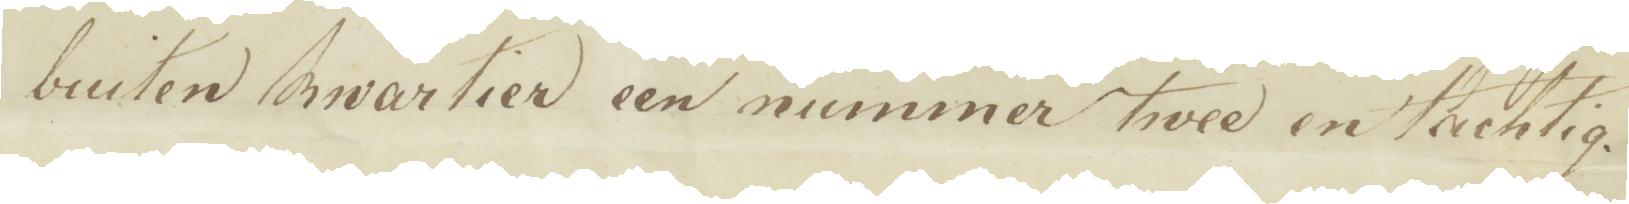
buiten kwartier een nummer twee en tachtig.
